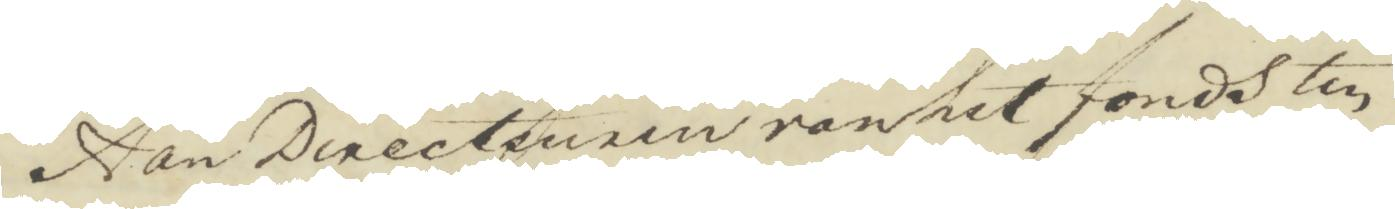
Aan Directeuren van het fonds ten
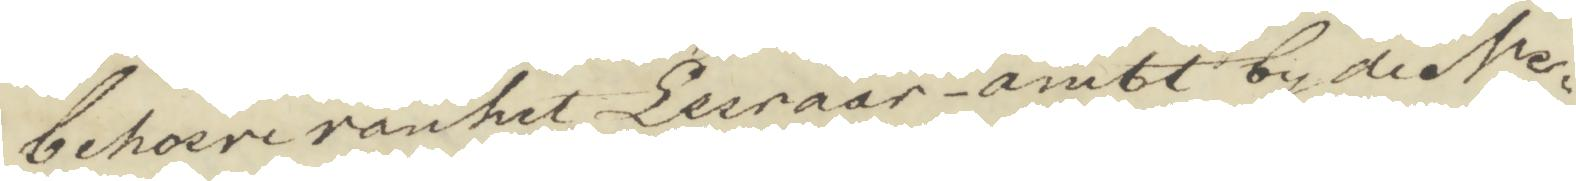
behoeve van het Leeraar-ambt by de Ne„
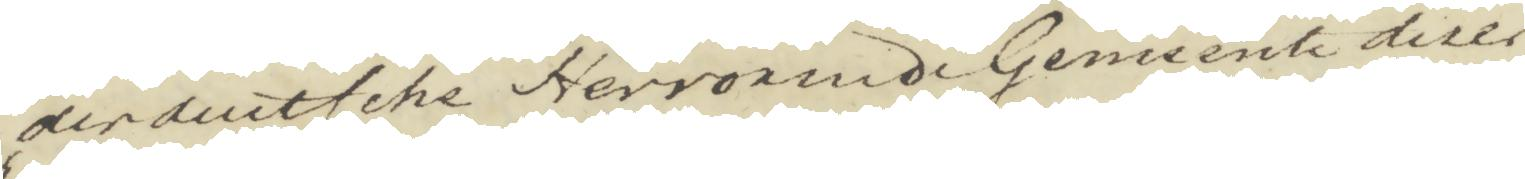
der duitsche Hervormde Gemeente dezer
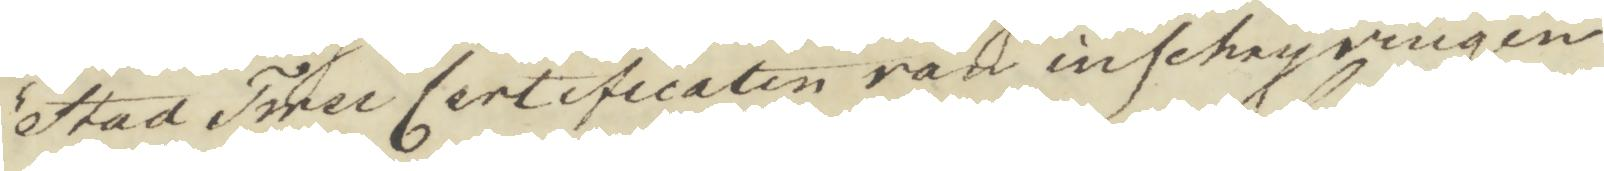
stad Twee Certificaten van inschryvingen
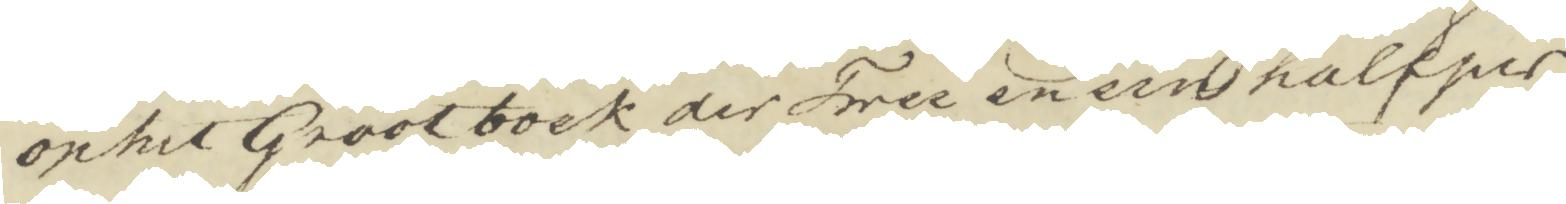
op het Grootboek der Twee en een halfper
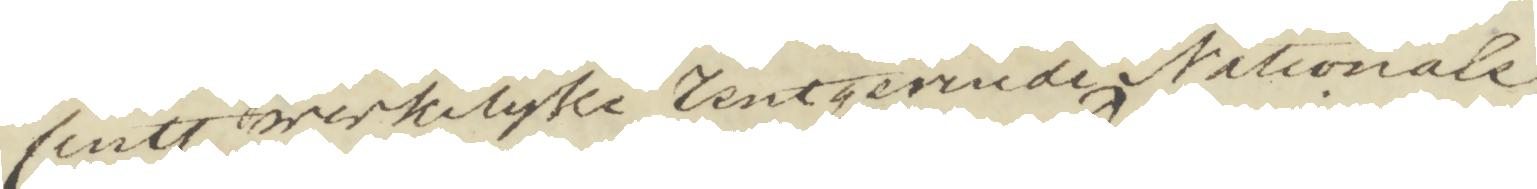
cents werkelyke rentgevende Nationale
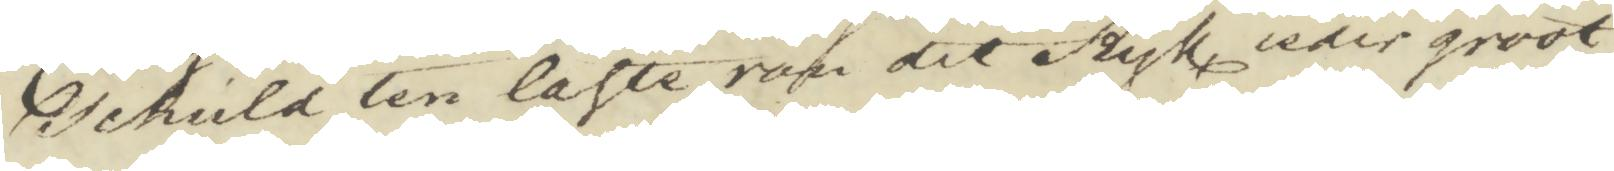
schuld ten laste van dit Ryk, ieder groot
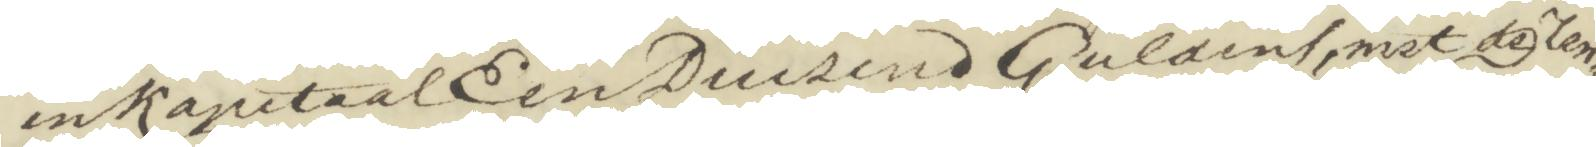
in Kapitaal Een Duizend Guldens, met de ren
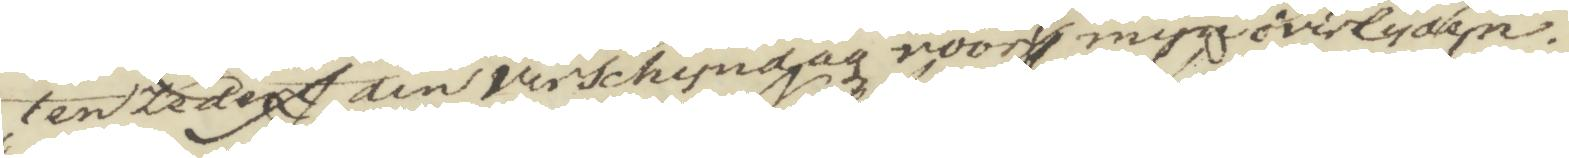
ten zedert den verschyndag voor myn overlyden.
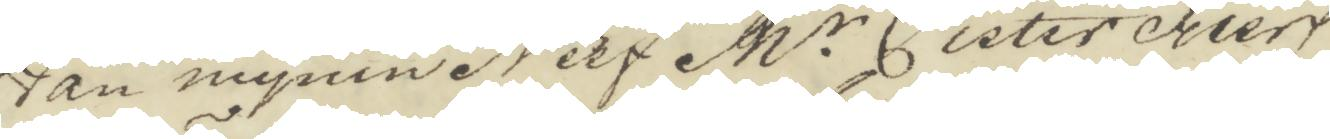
Aan mynen Neef M.r Pieter Fiers
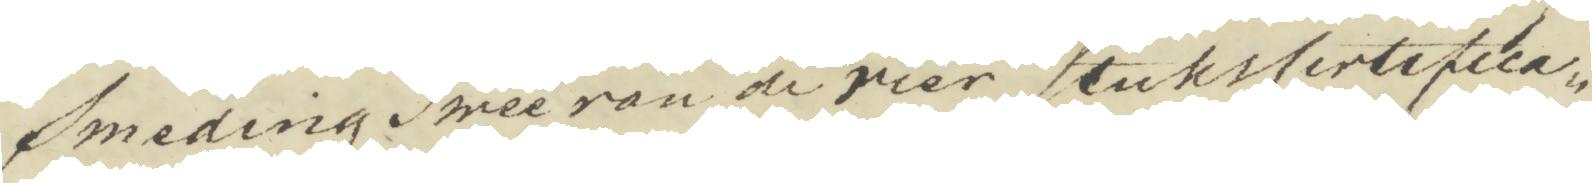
Smeding Twee van de vier stukscertifica„
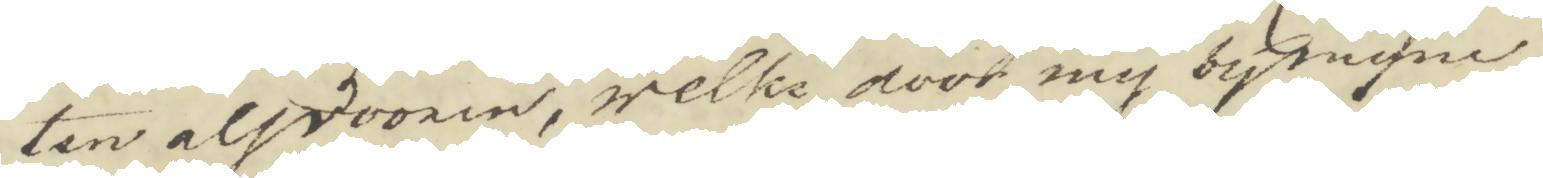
ten alsvooren, welke door my by myne
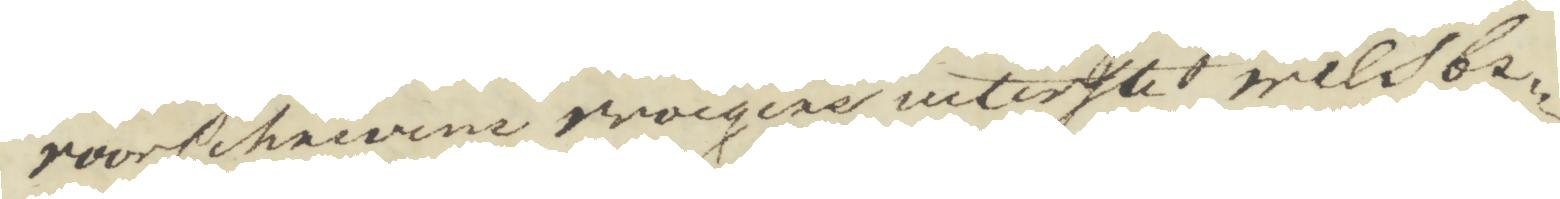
voorschrevene vroegere uiterste wilsbe„
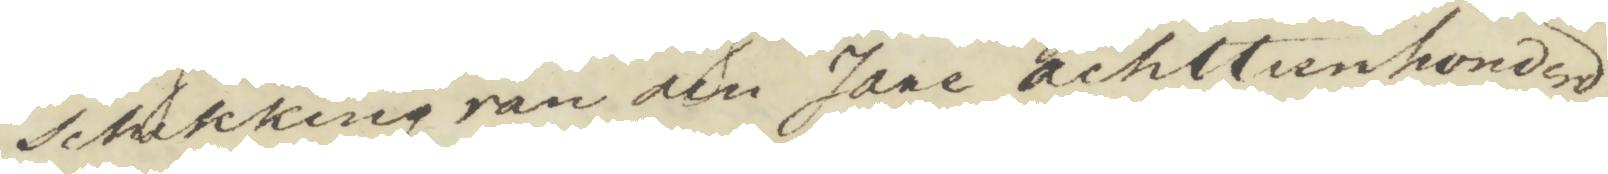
schikking van den Jare achttienhonderd
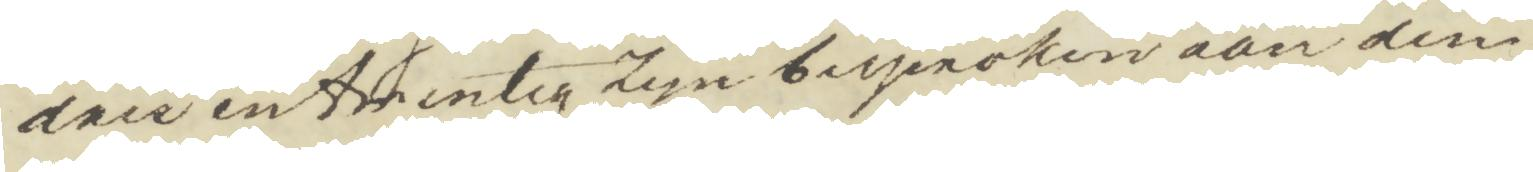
drie en twintig zyn besproken aan den
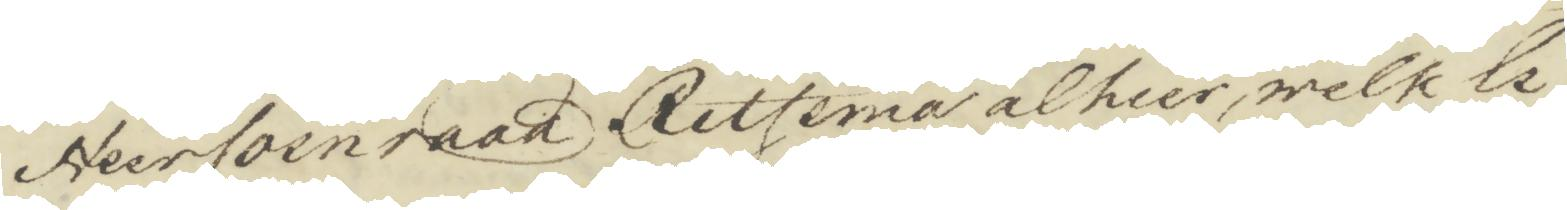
Heer Coenraad Ritsema alhier, welk le
